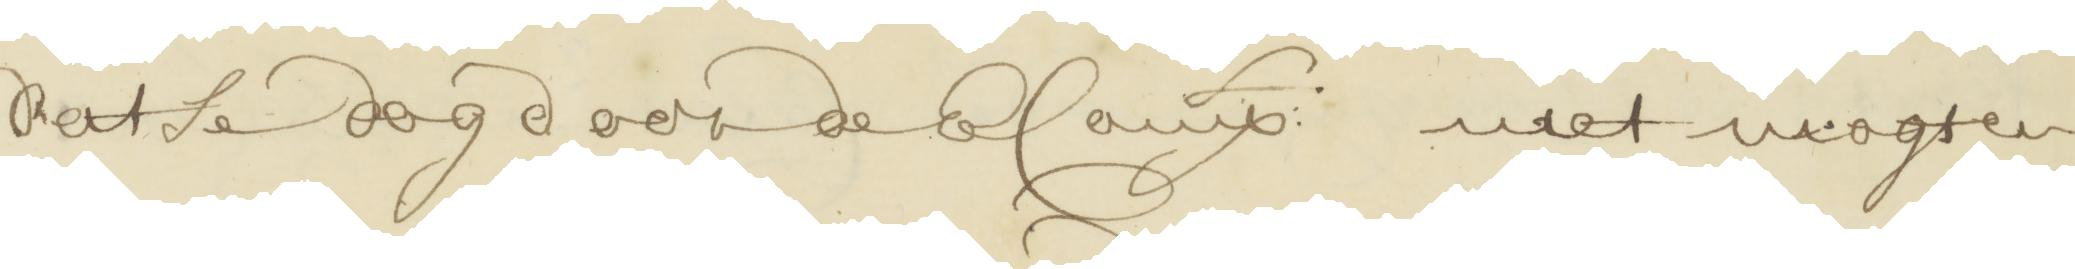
dat se dog door de EComp: niet mogten
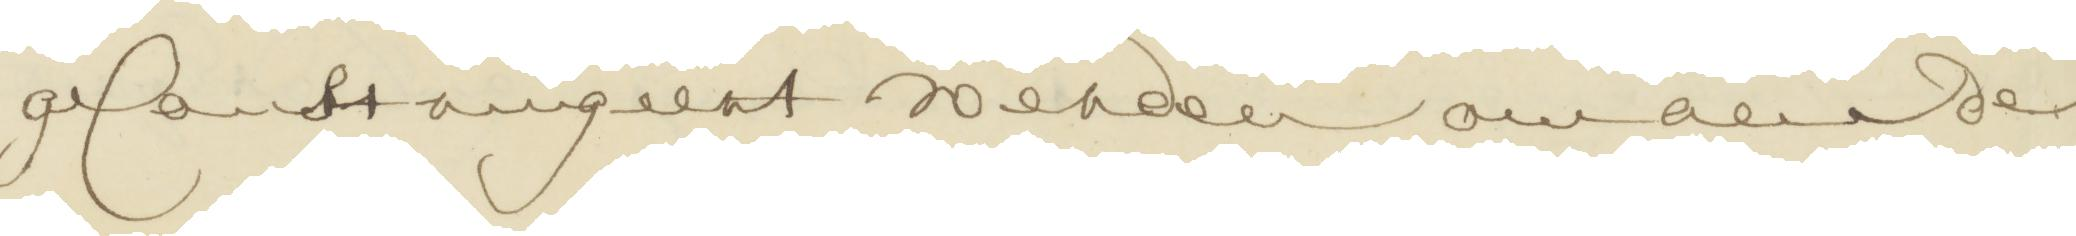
geconstangeert werden om aen de
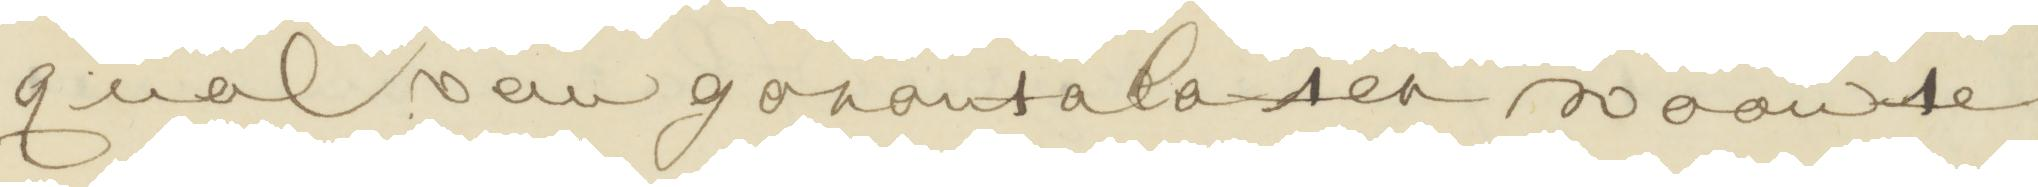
qual van gorontala ter woon te
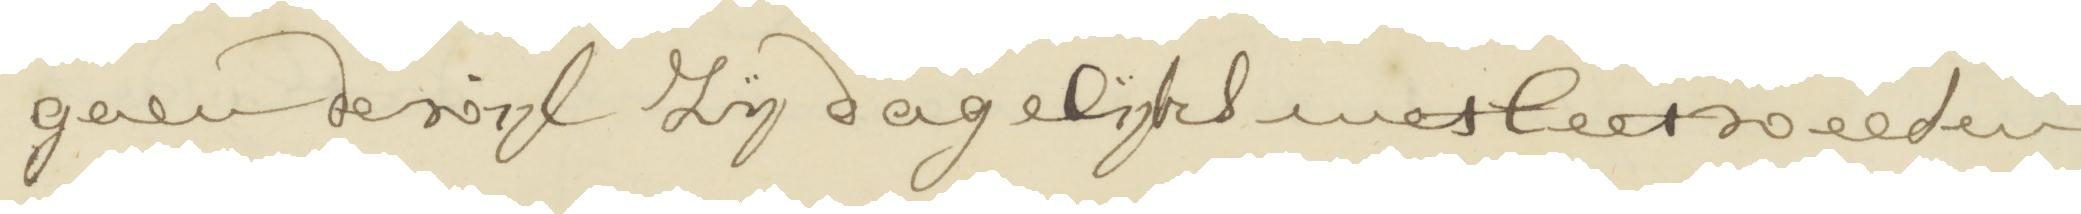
gaen dewijl zij dagelijks met leetweesen
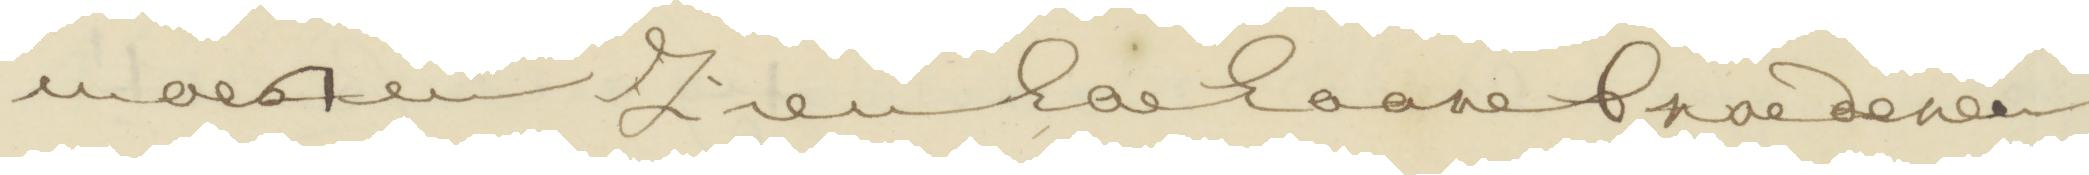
moesten zien hoe haare broederen
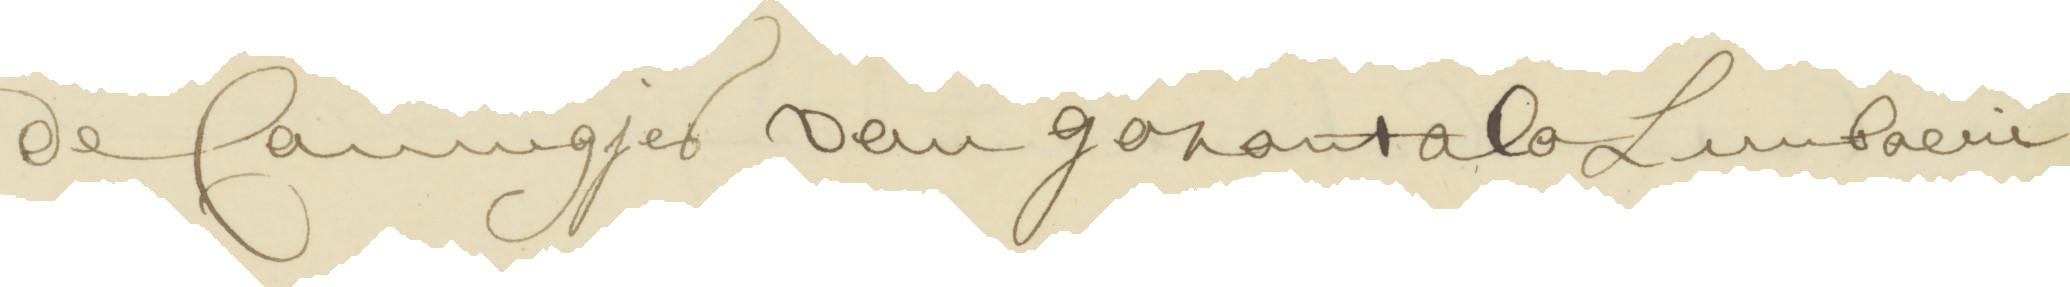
de Coningjes van gorontalo Limbaerie
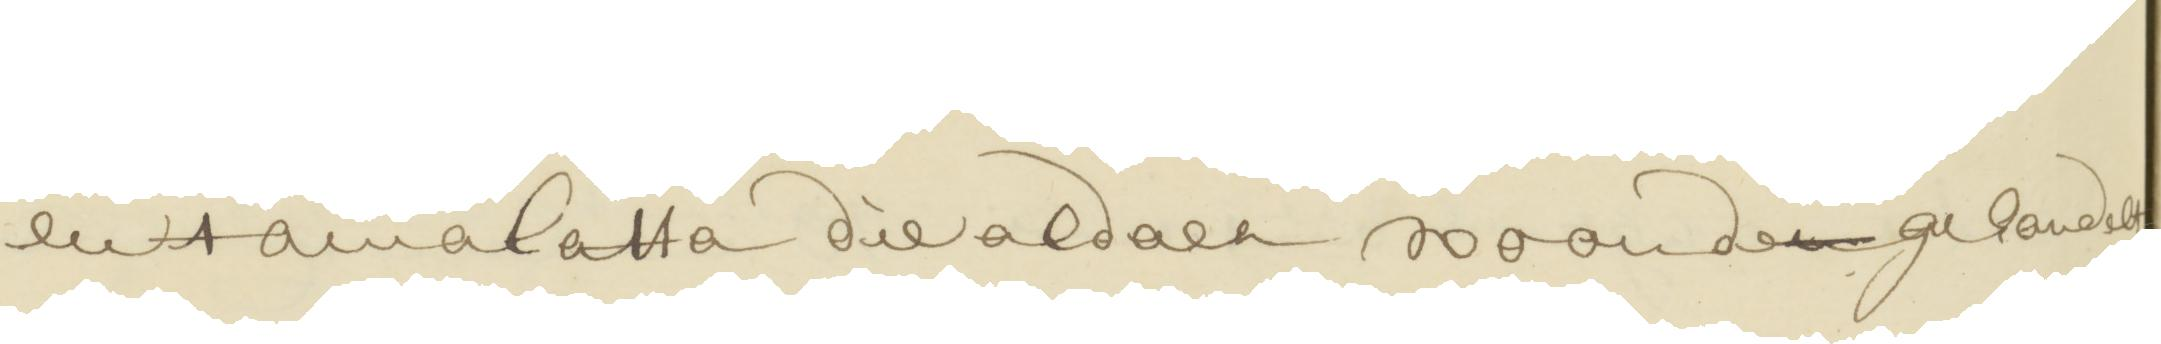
en t amalatta die aldaer woonden gehandelt
